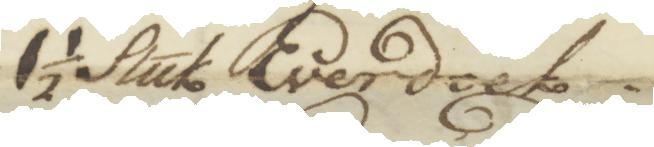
1 ½ stuk Everdoek
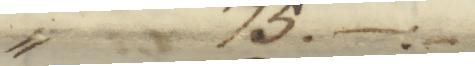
„ 75.—:—
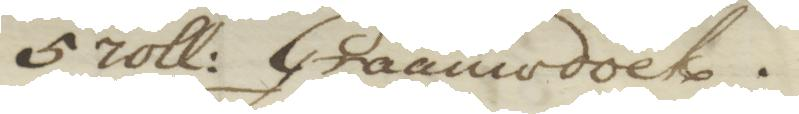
5 roll: Graauwdoek.
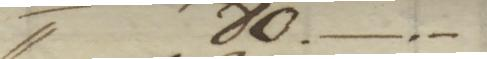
„- 80.—.—
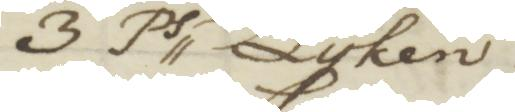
3 P„s Lijken
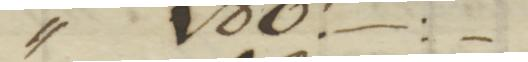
„ 180:—:—
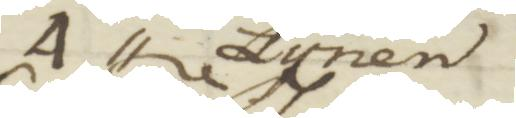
4 „ Lynen
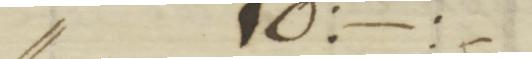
„ 10:—:—
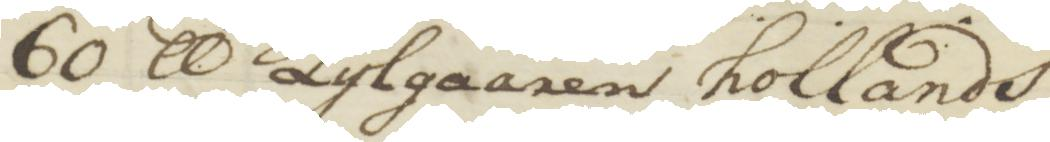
60 lb Zylgaaren hollands
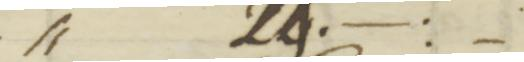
„ 24.—:—
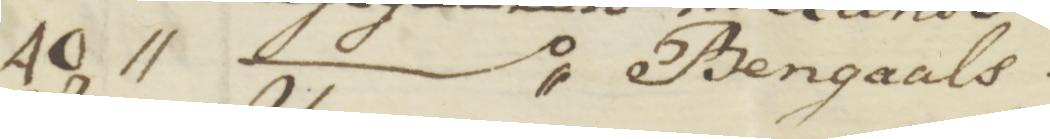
40 „ d„o Bengaals
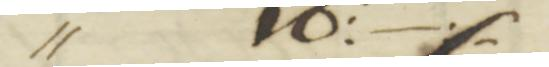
„ 16:—:—
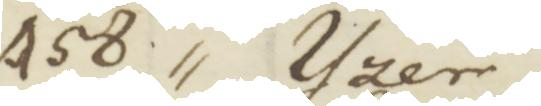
458 „ Yzer
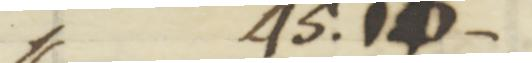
„ 45.16—
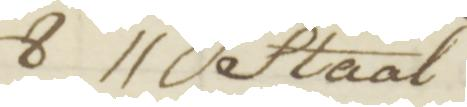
8 „ Staal
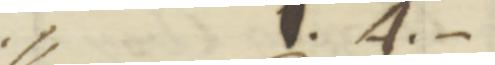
„ 1.4.—
